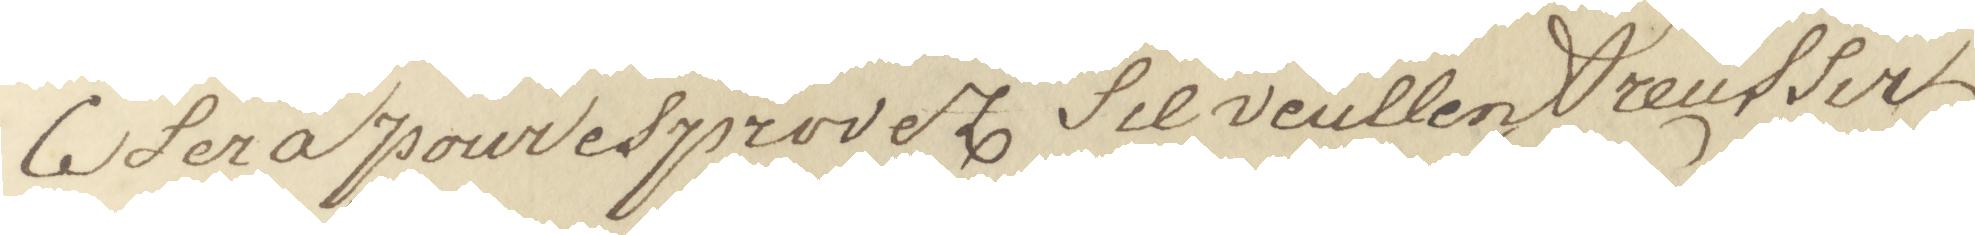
ce sera pour esprovez sil veullent reussir
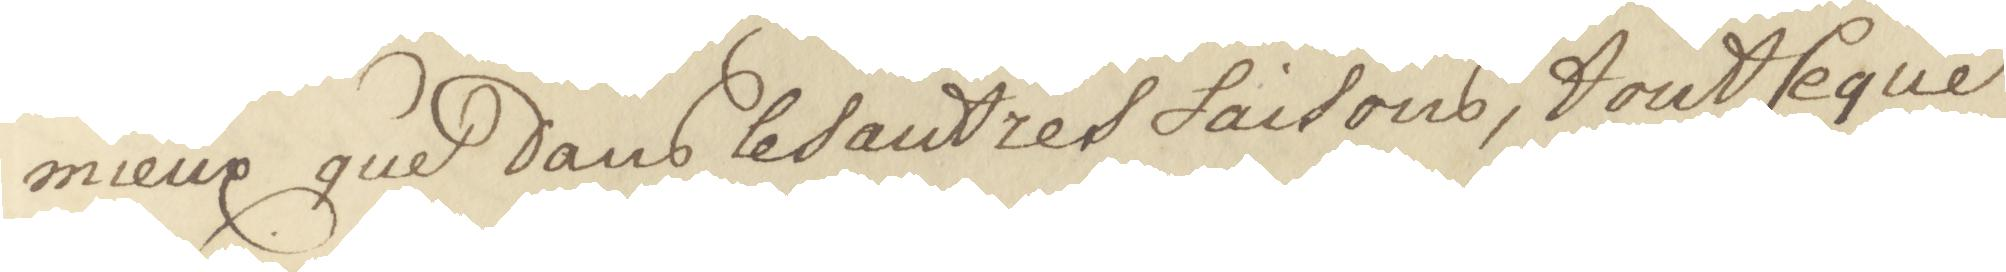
mieux que dans les autres saisons, tout Ce que
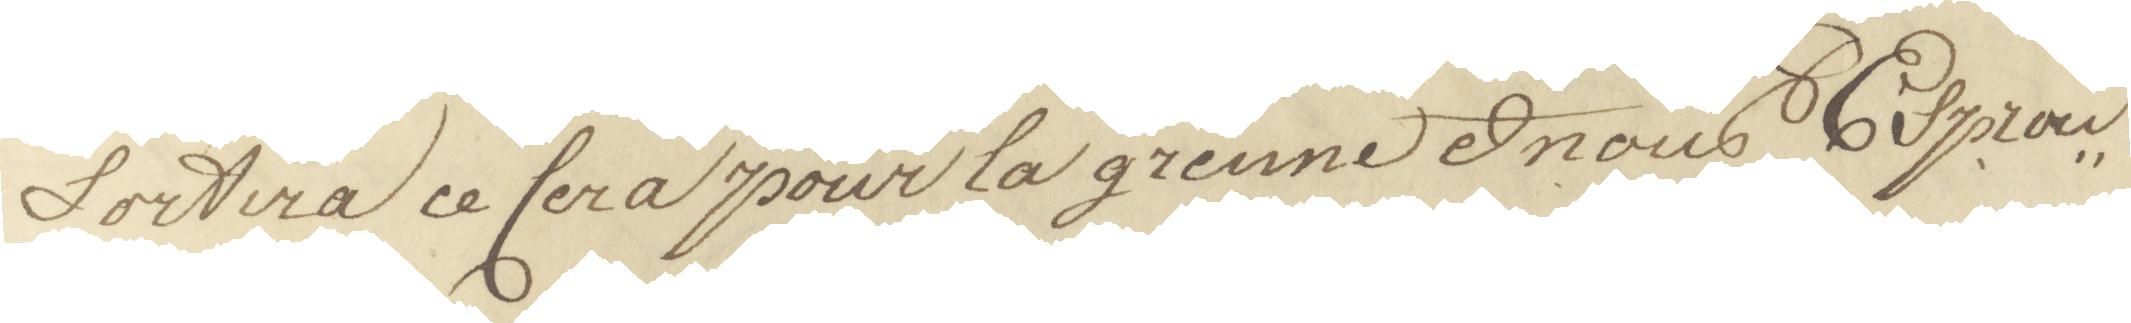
sortira ce Cera pour la grenne l nous Esprou„
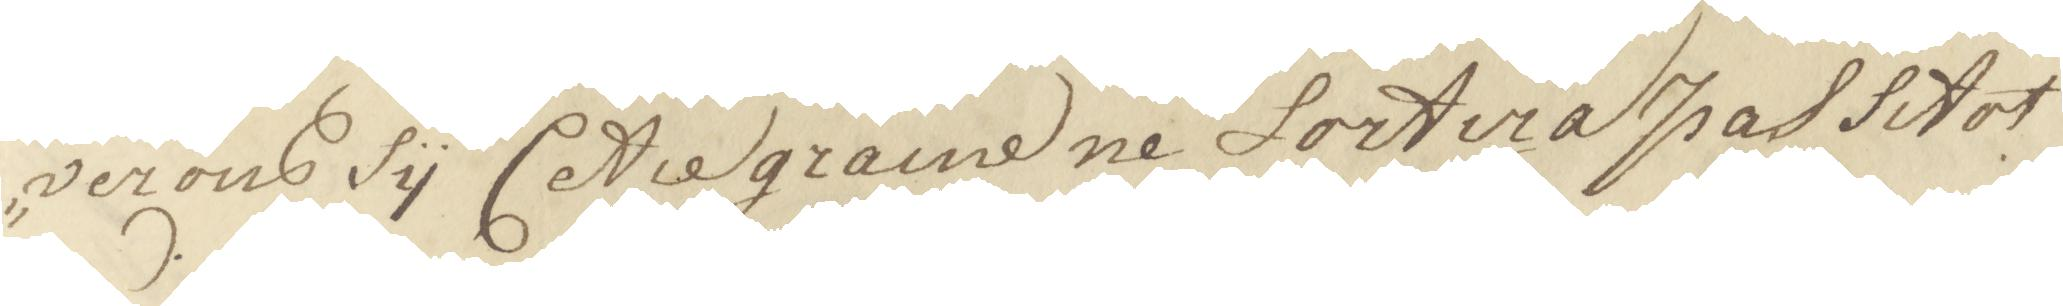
„verons sij Cetie graine ne sortira pas sitot
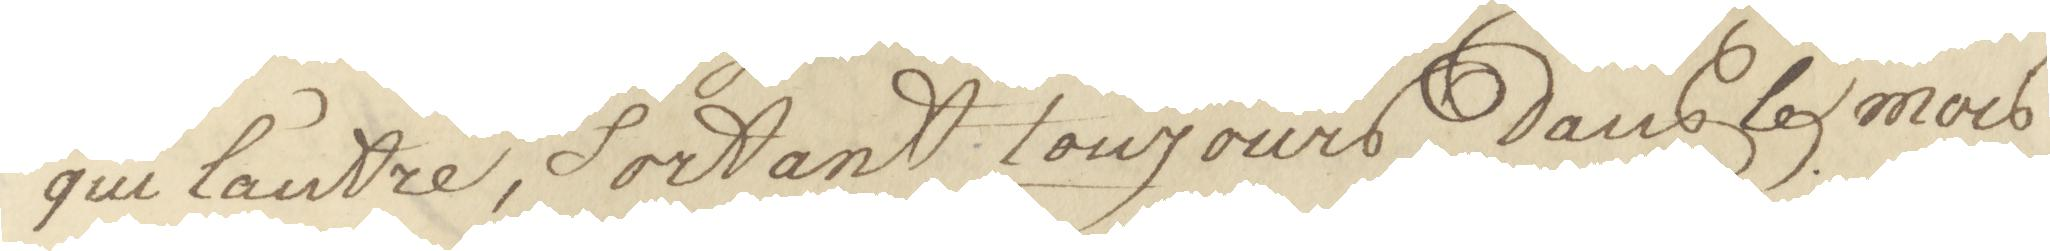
qui lautre, sortant toujours dans le mois
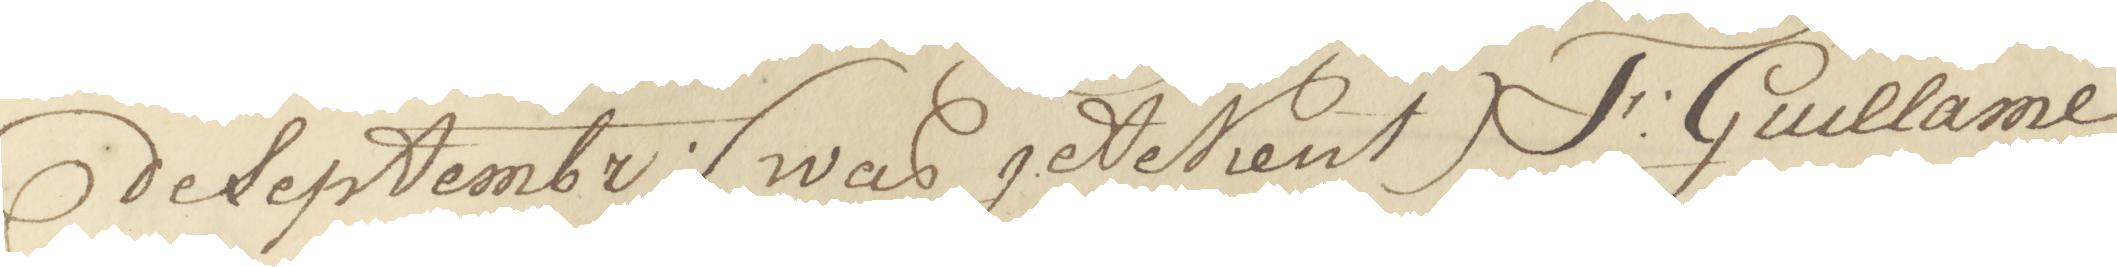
de septembr: ( was getekent) F: Guillame
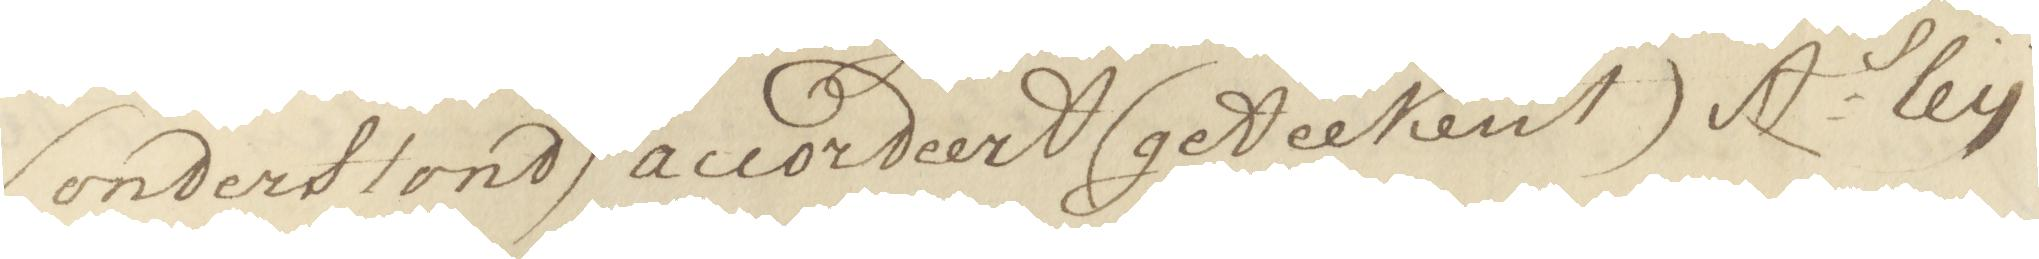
onderstond) accordeert (geteekent) A=s leij
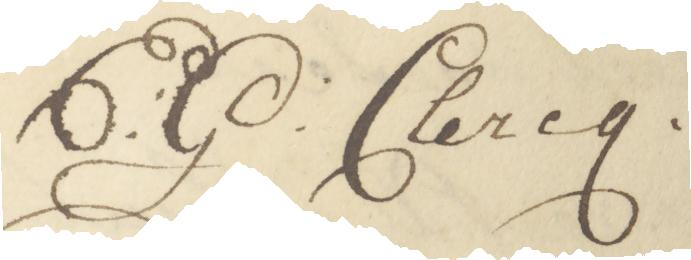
E: G: Clercq:
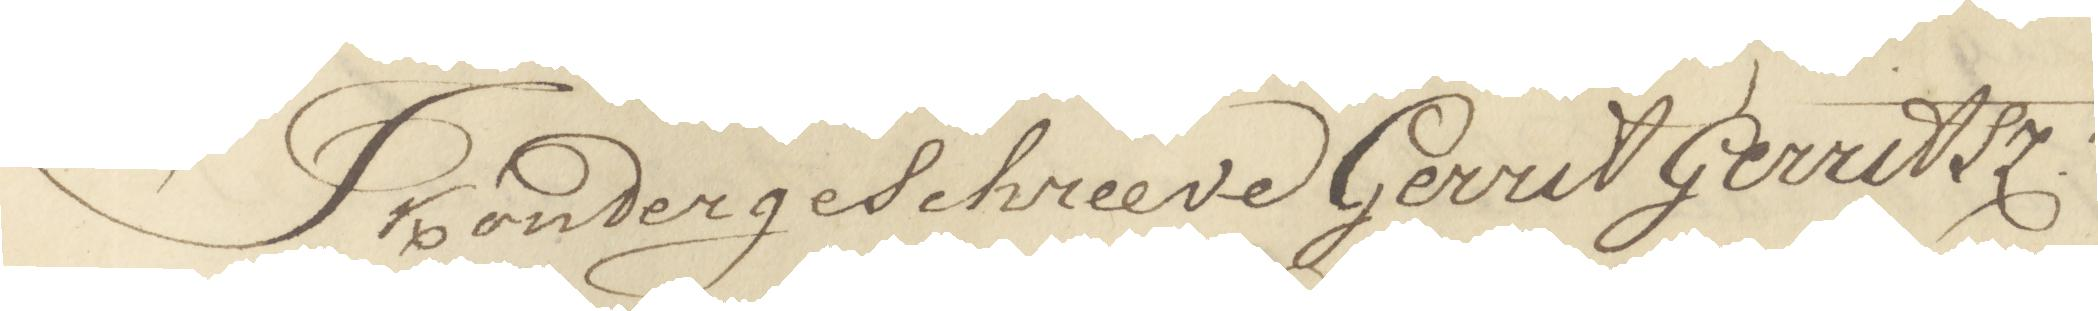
Ik ondergeschreeve Gerrit Gerritsz:
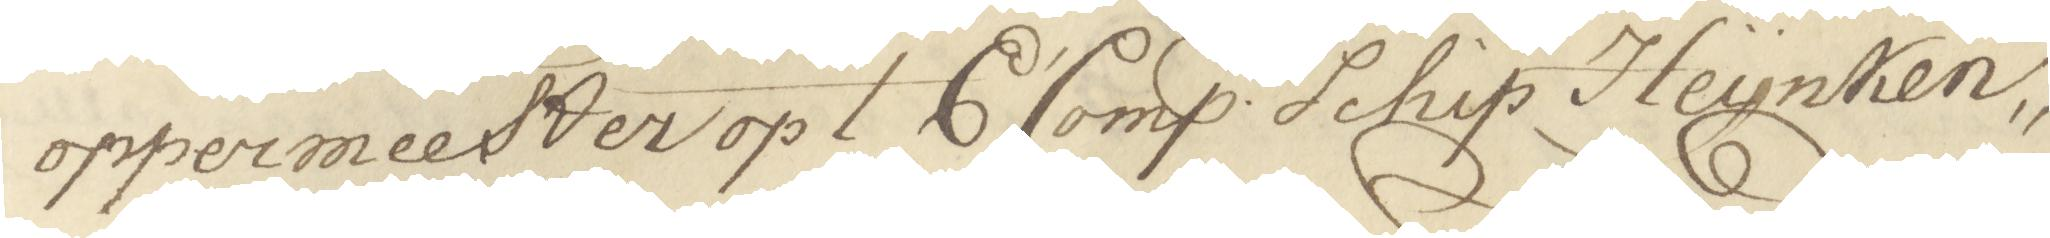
oppermeester op ’t E'Comp:e schip Heijnken„
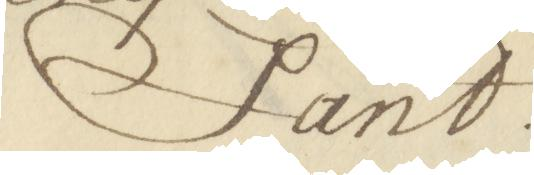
sand
